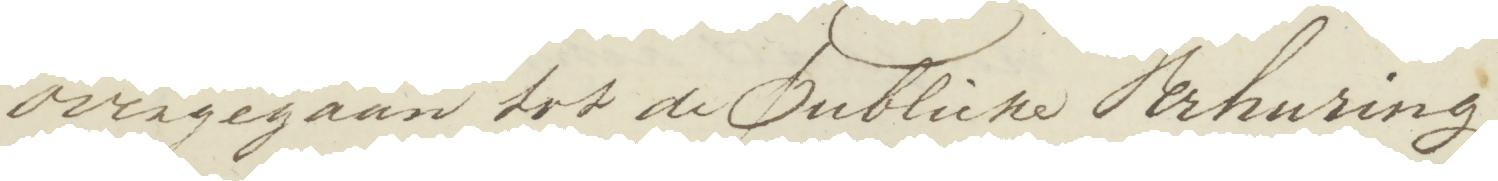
overgegaan tot de Publieke Verhuring
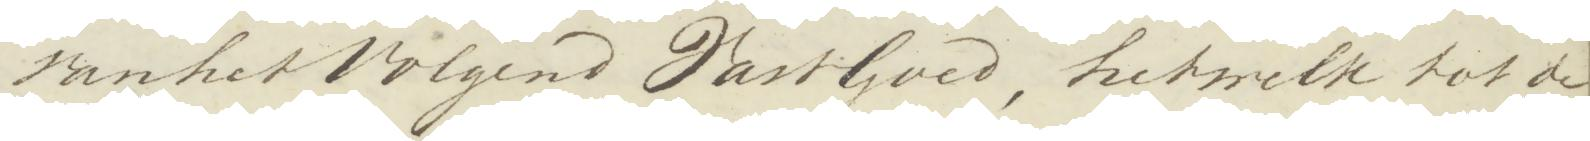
van het volgend Vast Goed, hetwelk tot de
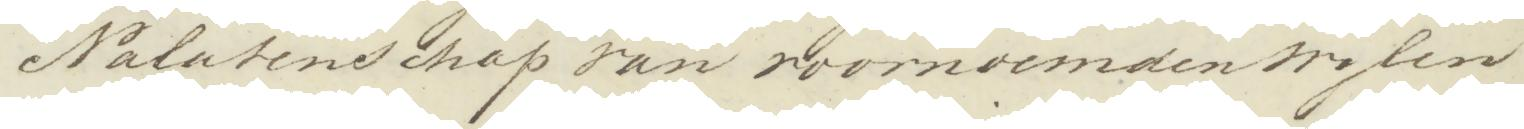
Nalatenschap van voornoemden wylen
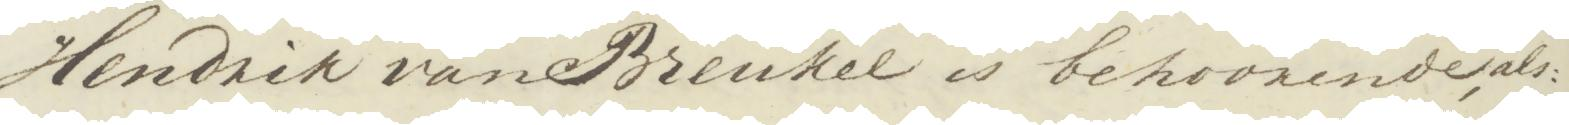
Hendrik van Breukel is behoorende, als:
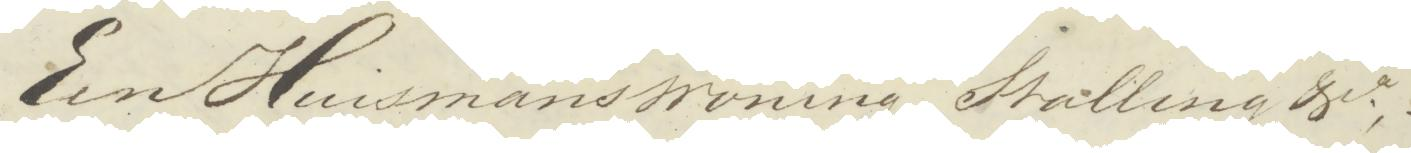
Een Huismanswoning, Stalling &c.a,
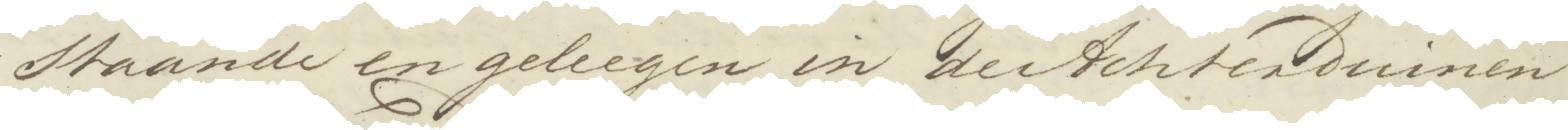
staande en geleegen in de Achterduinen
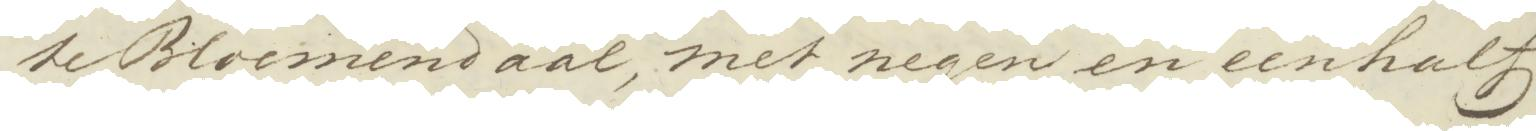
te Bloemendaal, met negen en een half
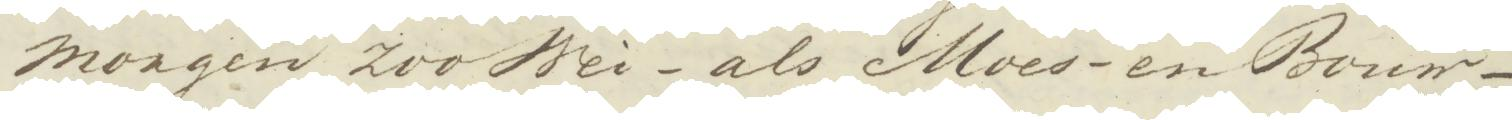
morgen, zoo Wei - als Moes - en Bouw-
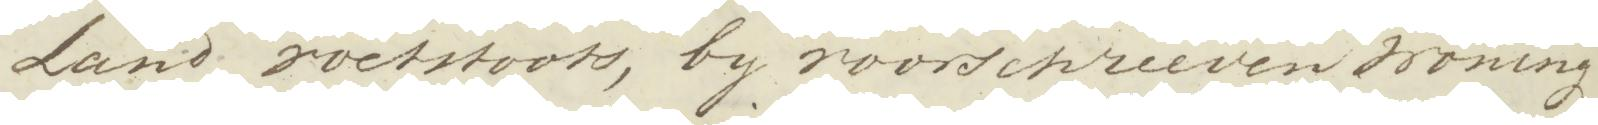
Land, voetstoots, by voorschreeven woning
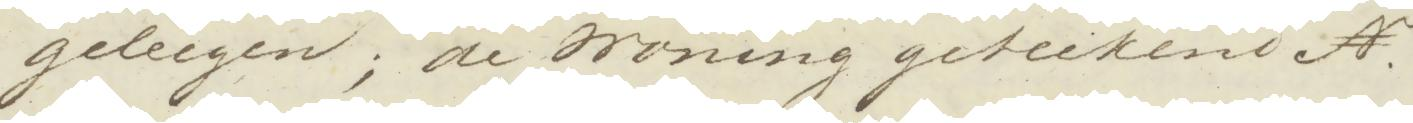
geleegen; de Woning geteekend N.o
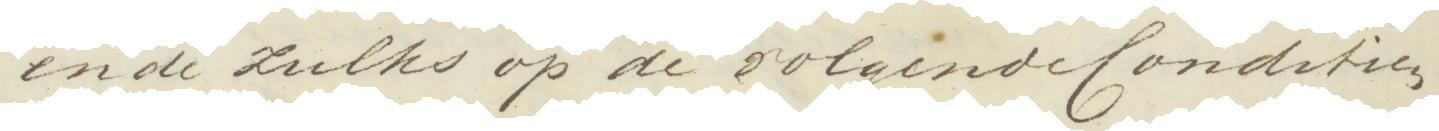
ende zulks op de volgende Conditien
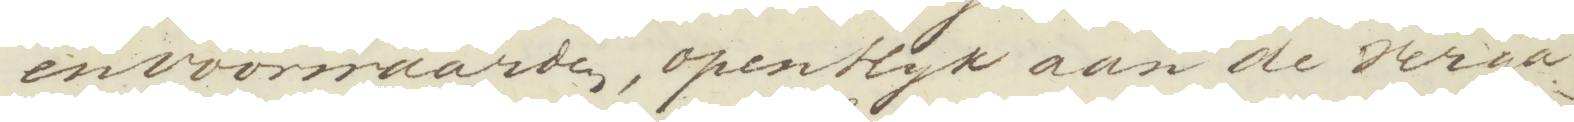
en voorwaarden, opentlyk aan de verga
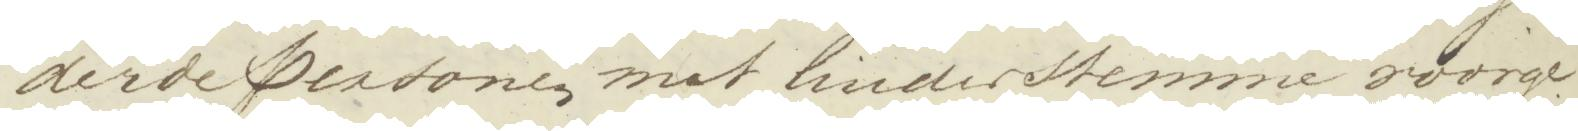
=derde Personen met kinderstemme voorge:
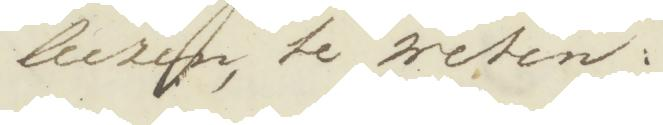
=leezen, te weten:
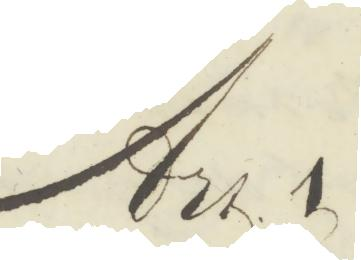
Art. 1
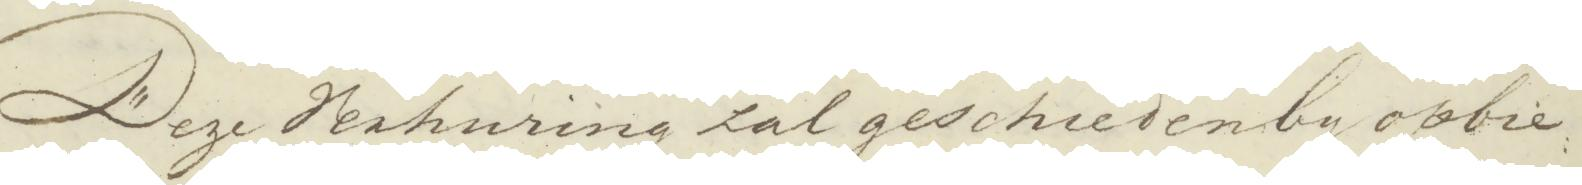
Deze Verhuring zal geschieden by opbie:
